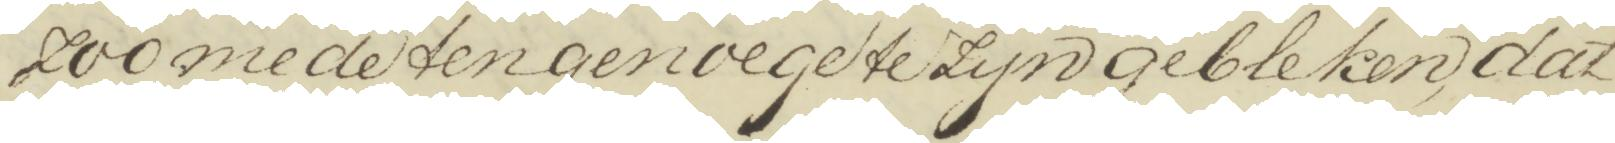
zoo mede ten genoege te zyn gebleken, dat
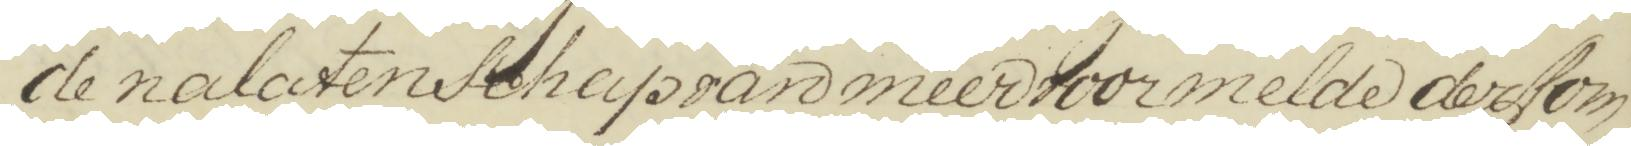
de nalatenschap van meer voormelde der com
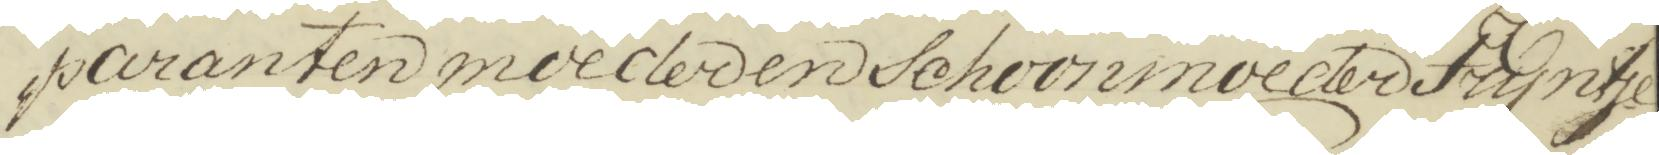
paranten moeder en schoonmoeder Tryntje
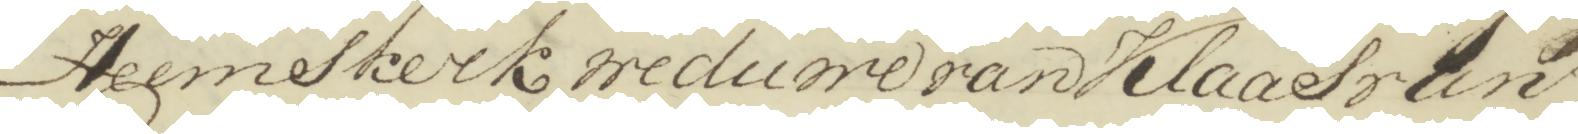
Heemskerk, weduwe van Klaas van
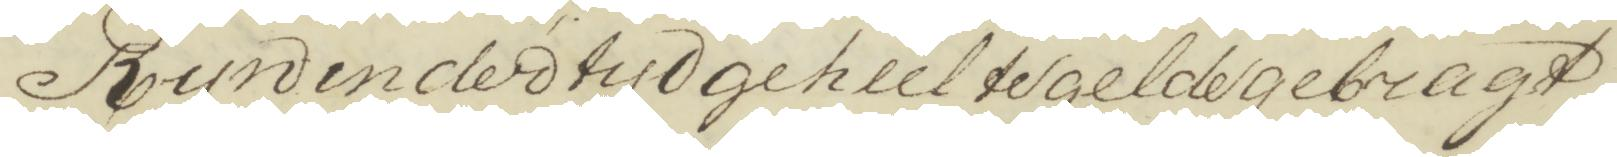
Ryn en dertyd geheel te gelde gebragt
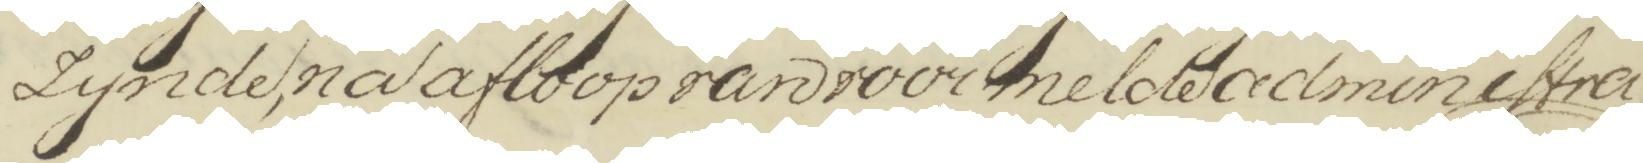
zynde, na afloop van voormelde administra
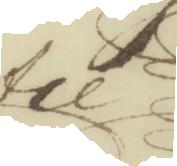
tie
